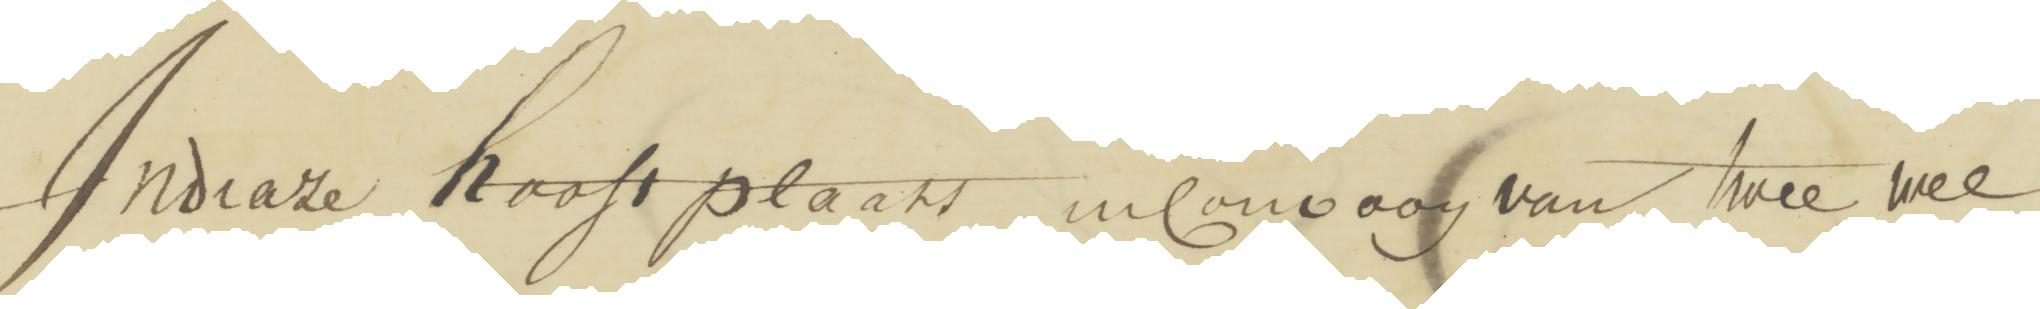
Jndiaze hooft plaats in convooy van twee wel
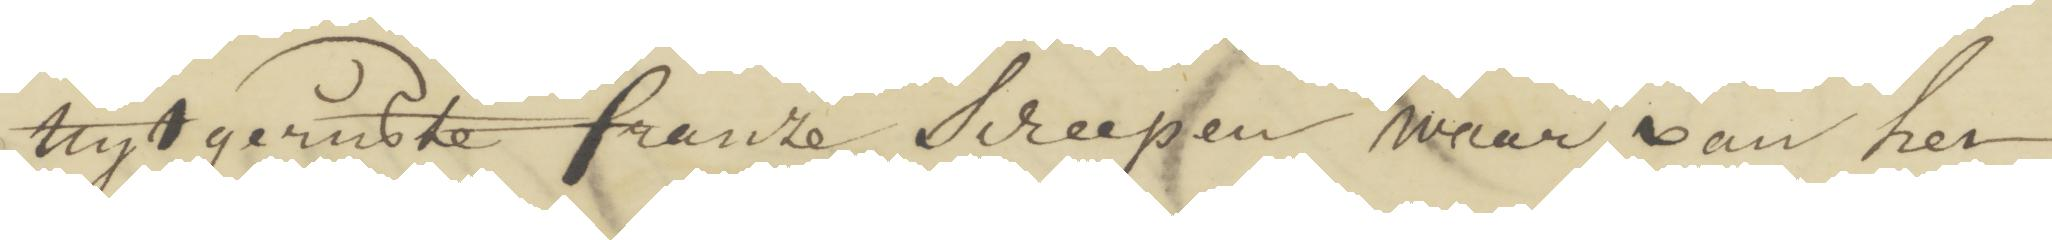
uyt geruste franze scheepen waar van het
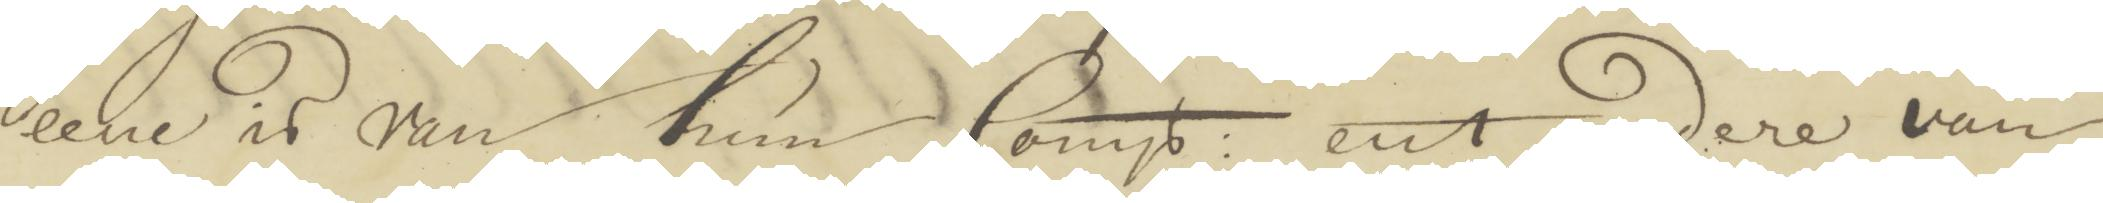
eene is van hun Comp: ent andere van
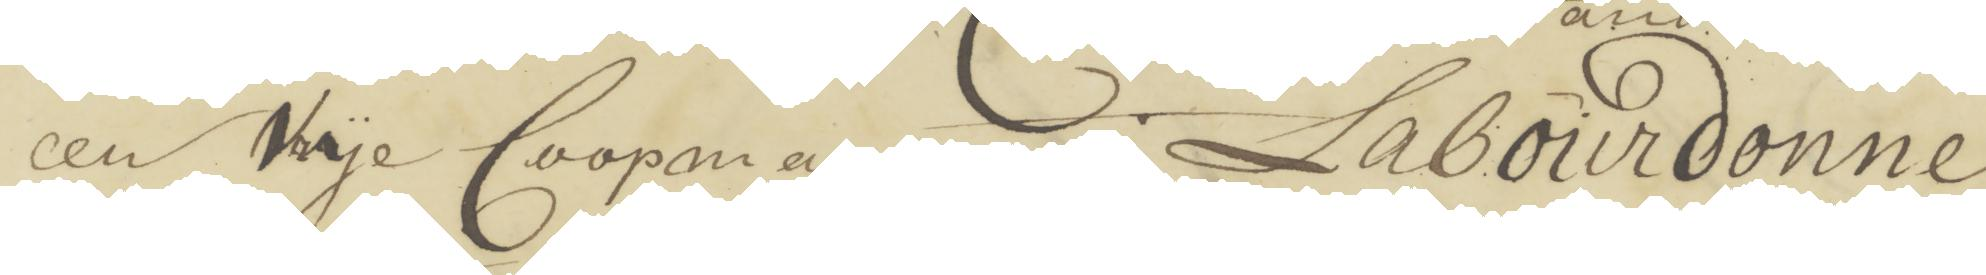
een vrije Coopman gent Labourdonne
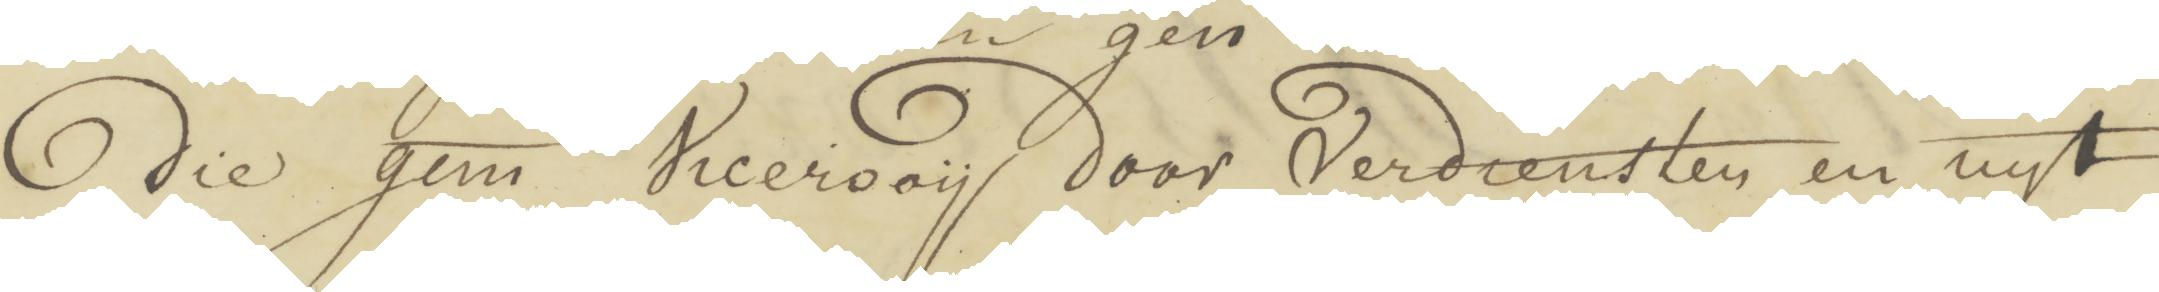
die gem Vicerooij door Verdiensten en uyt
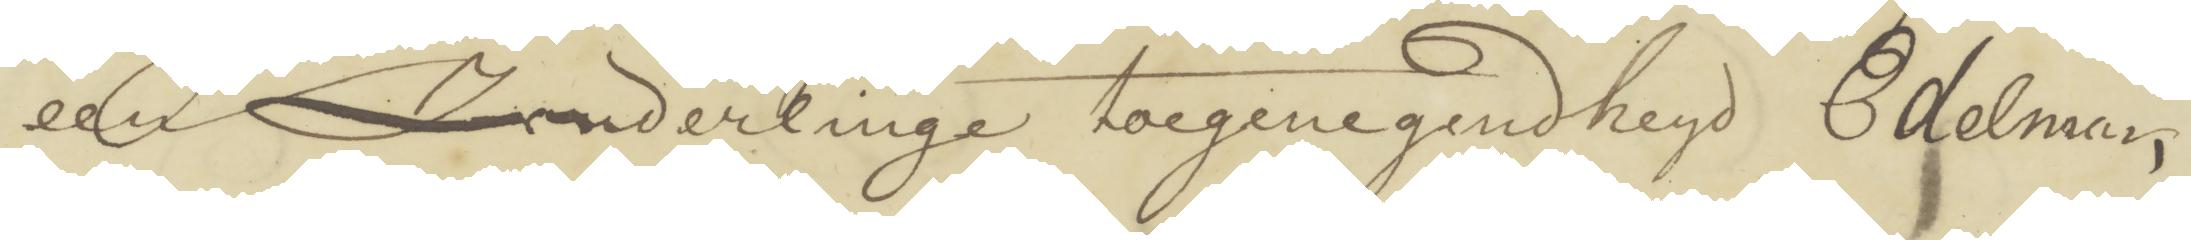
een zonderlinge toegenegendheyd Edelman
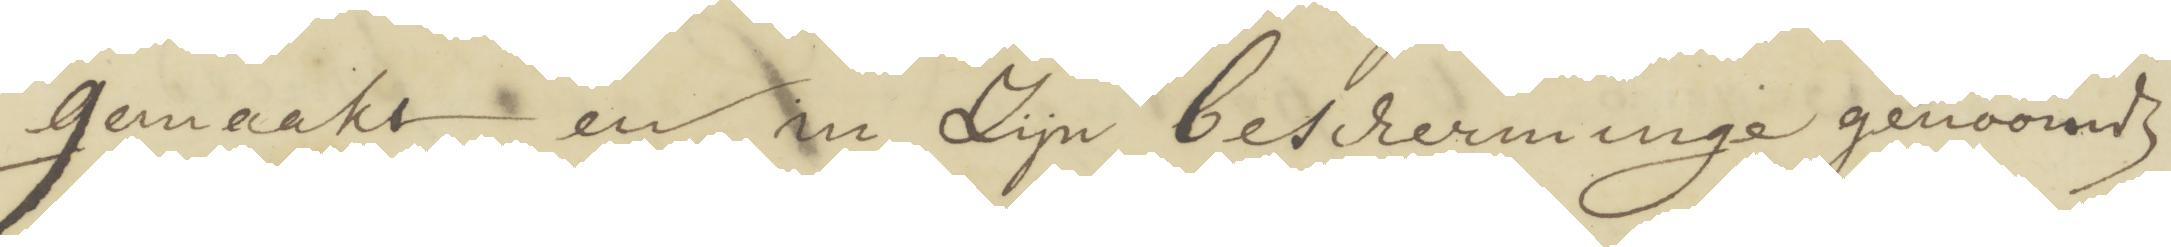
gemaakt en in zijn bescherminge genoomen
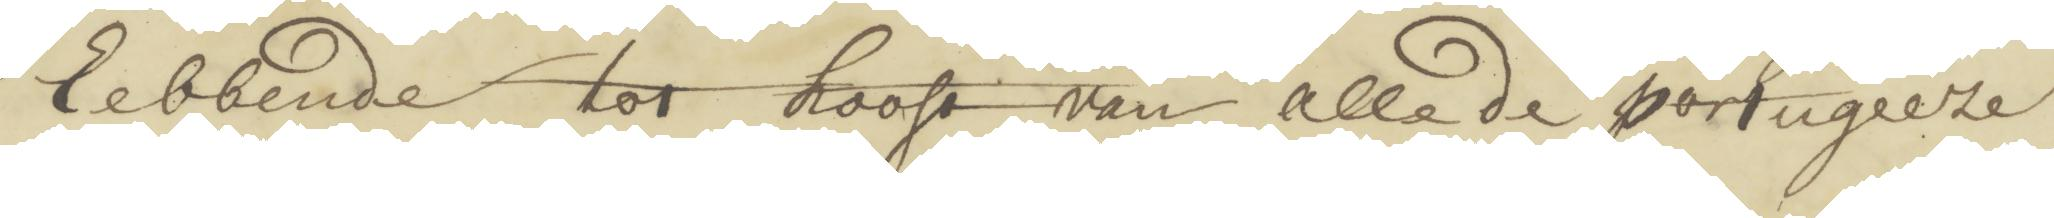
hebbende tot hooft van alle de portugeeze
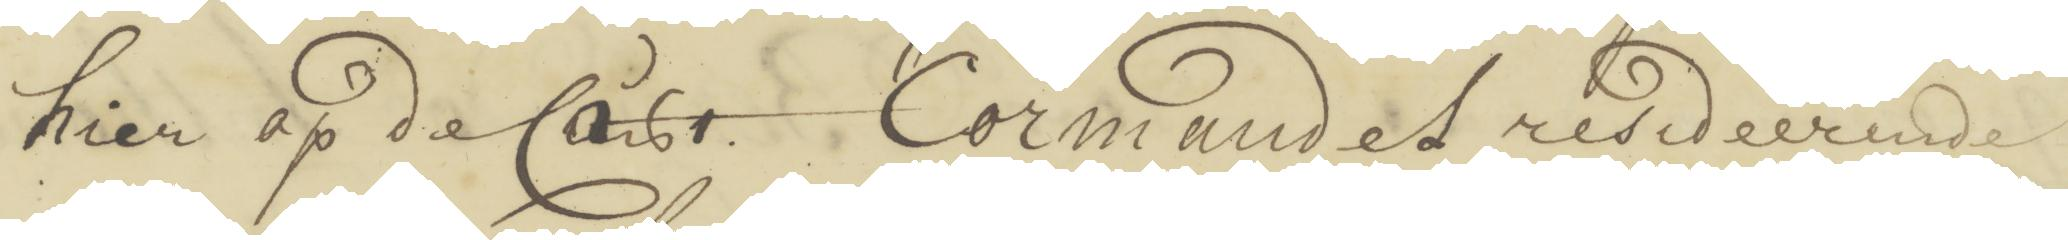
hier op de Cust Cormandel resideerende
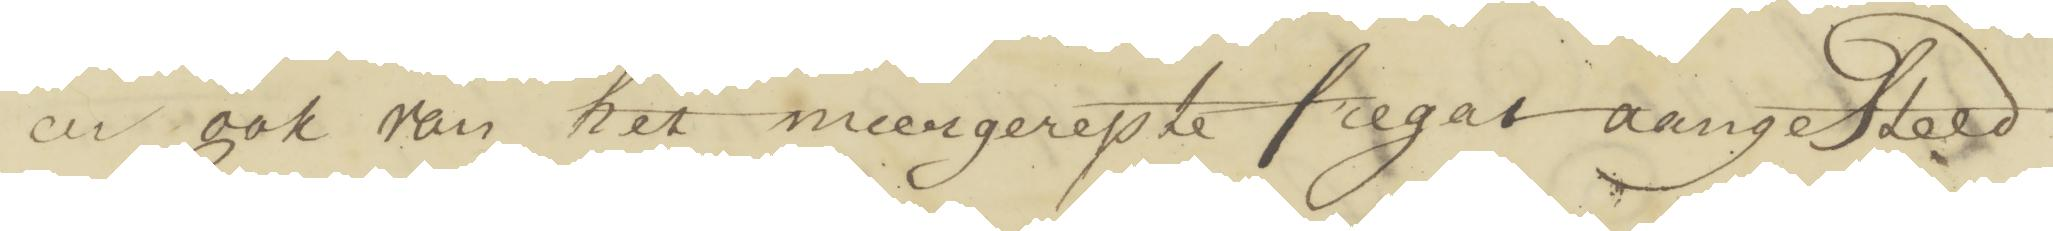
en ook van het meergerepte fregat aangesteld
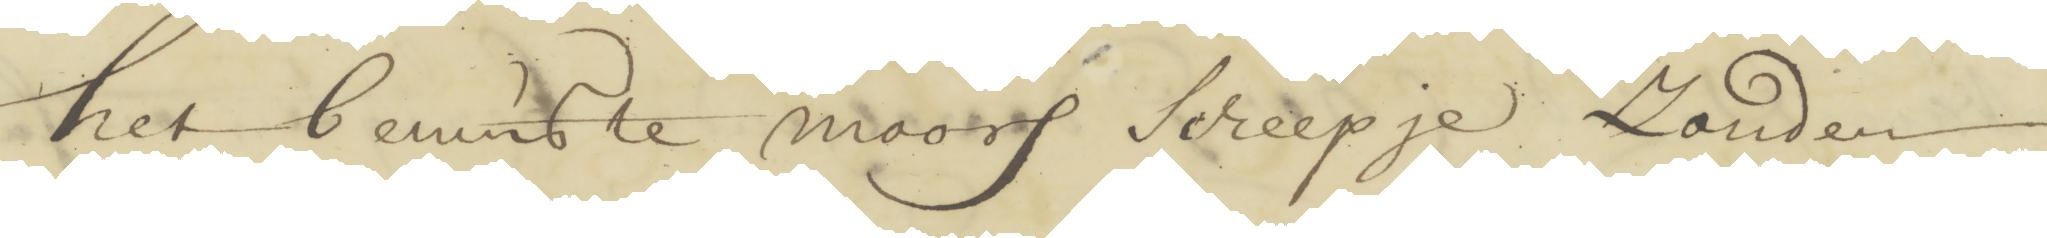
het bewuste moors scheepje zonden
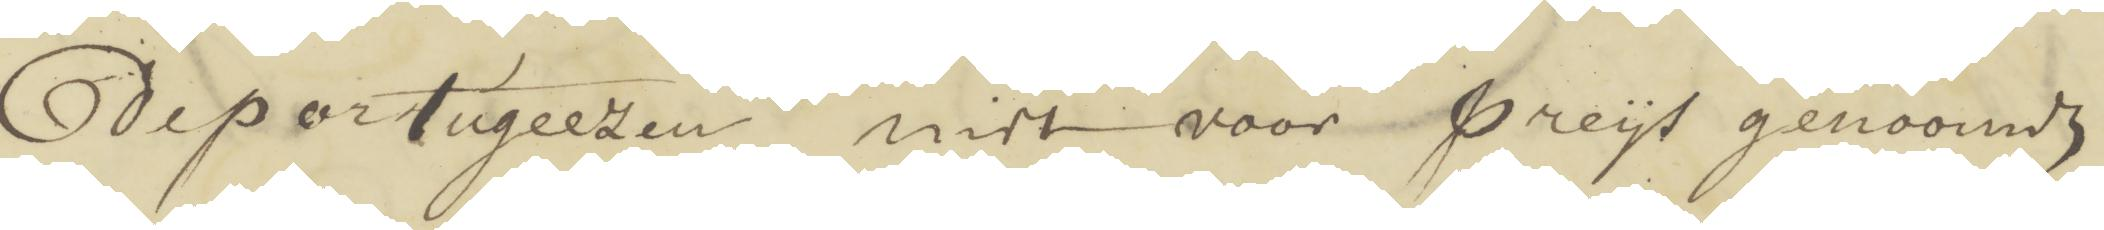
de portugeezen niet voor preijs genoomen
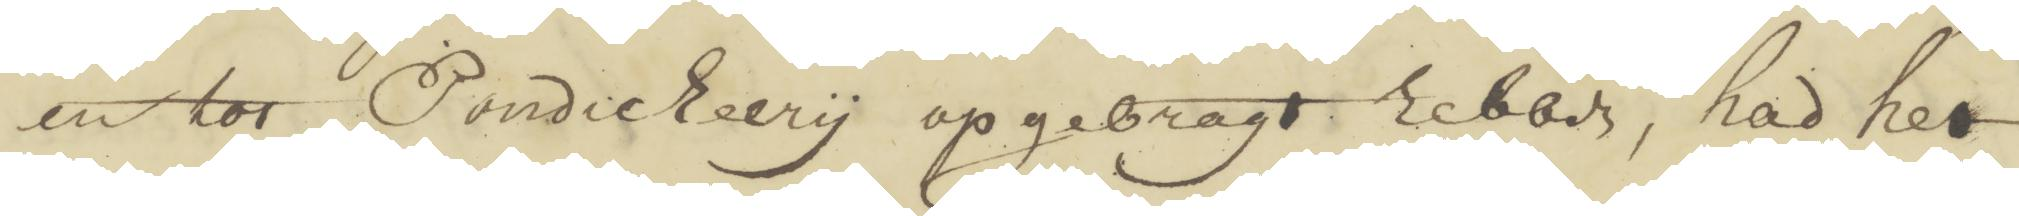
en tot Pondicheerij opgebragt hebben, had het
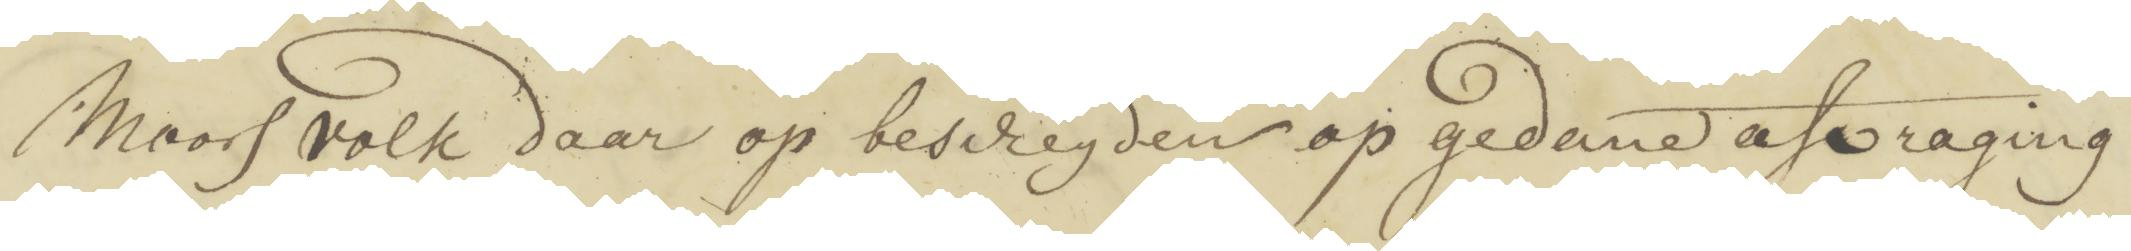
Moors volk daar op bescheyden op gedane afvraging
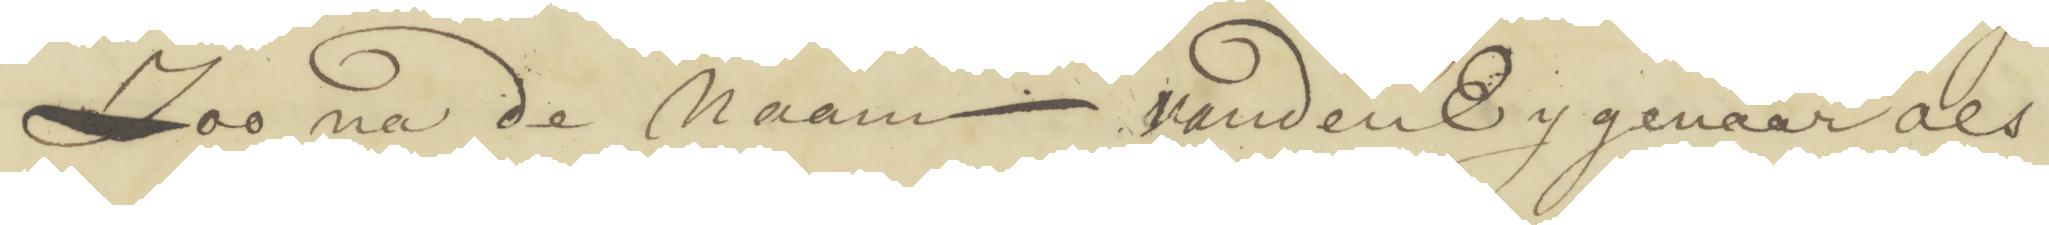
zoo na de naam vanden Eygenaar als
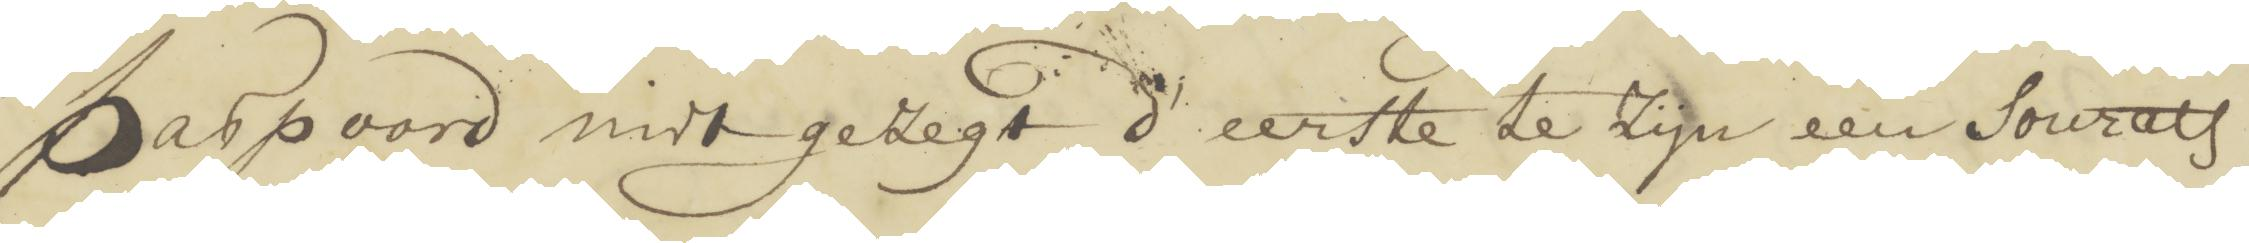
Paspoord niet gezegt d' eerste te zijn een sourats
